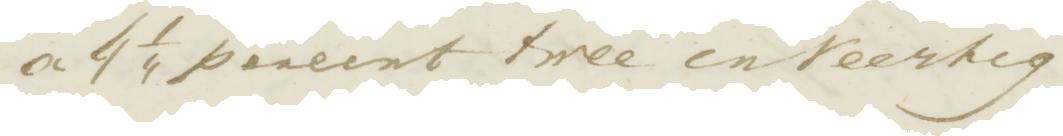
a 4¼ percent twee en Veertig
